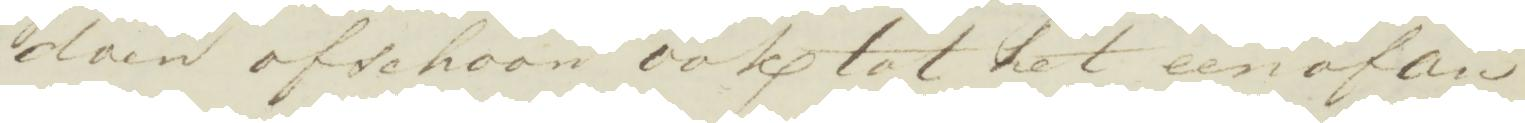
doen of schoon ook tot het een of an
